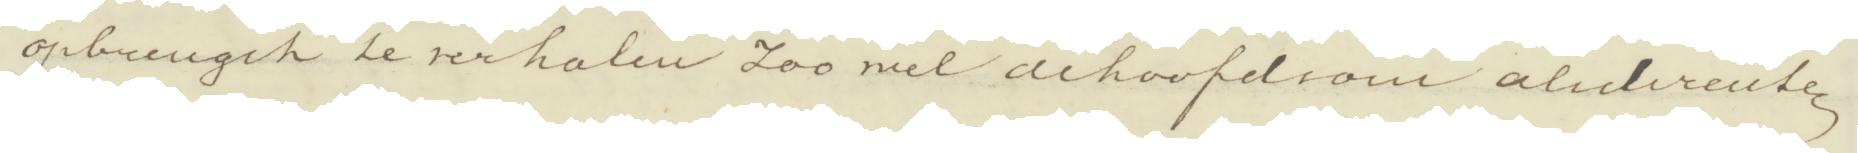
opbrengst te verhalen zoo wel de hoofdsom als derenten
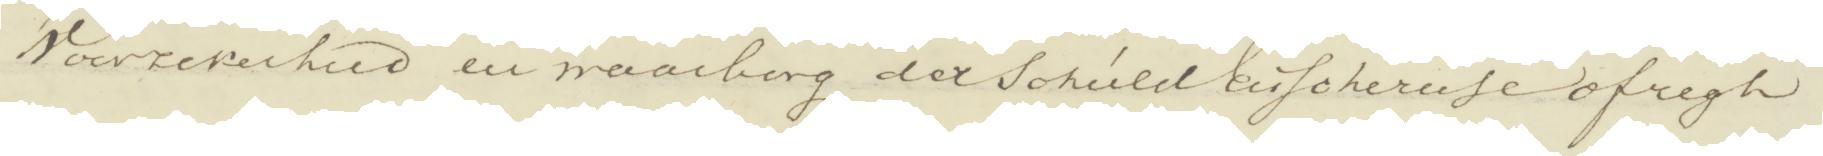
Voorzekerheid en waarborg der schuld Eisscheresse of regt
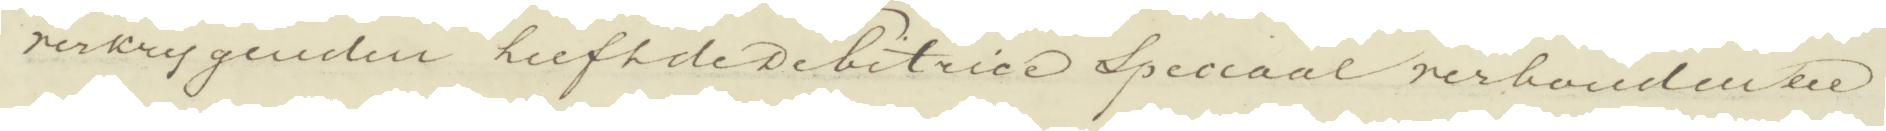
verkrygenden heeft de debitrice speciaal verbonden en
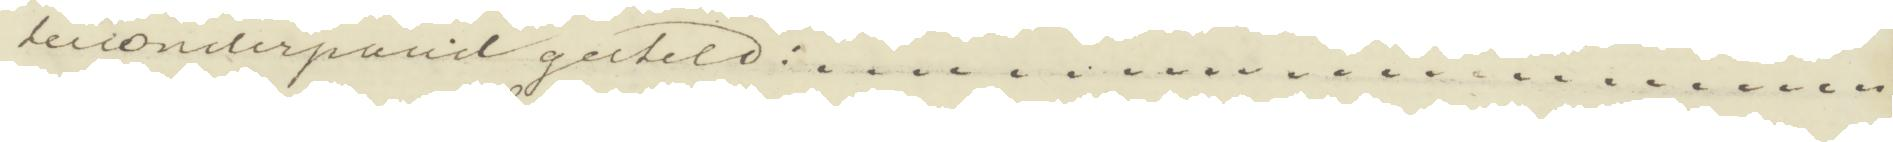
ten onderpand gesteld: . . . . . . - - - - - - - - - - - . - - - -
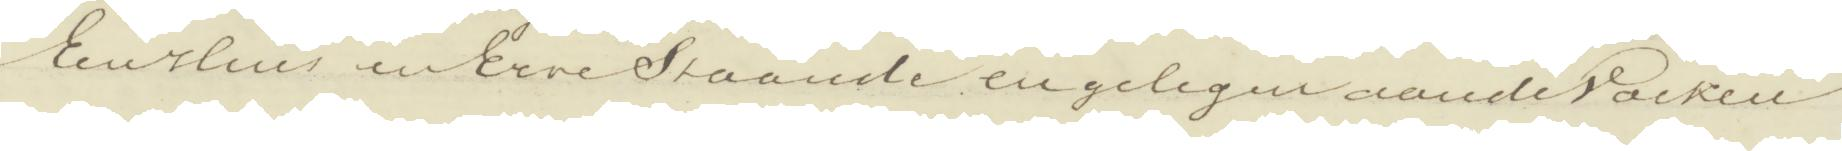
Een huis en Erve staande en gelegen aande Varken
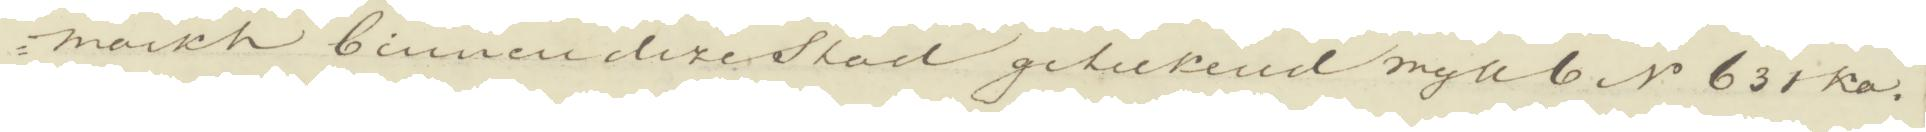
=markt binnen deze stad geteekend wyk 6 n. 631 ka,
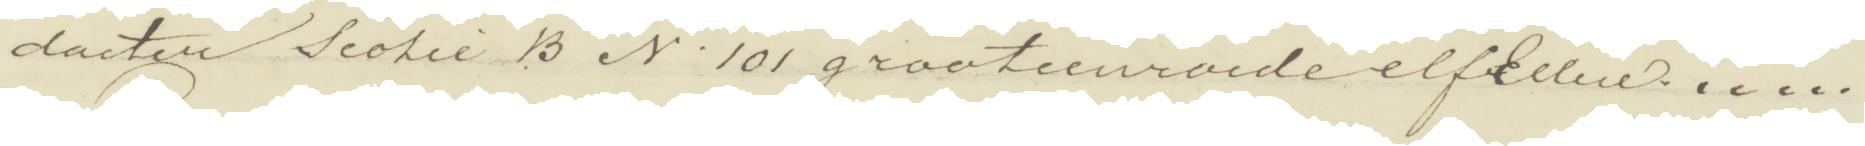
daster sectie B N. 101 groot eenroede elf Ellen., , , , .
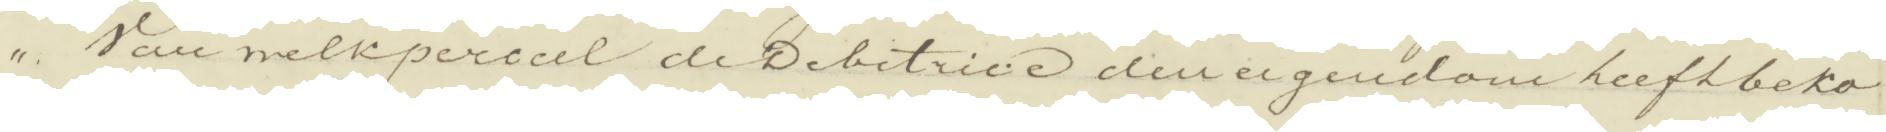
„. Van welk perceel de Debetrice den eigendom heeft beko
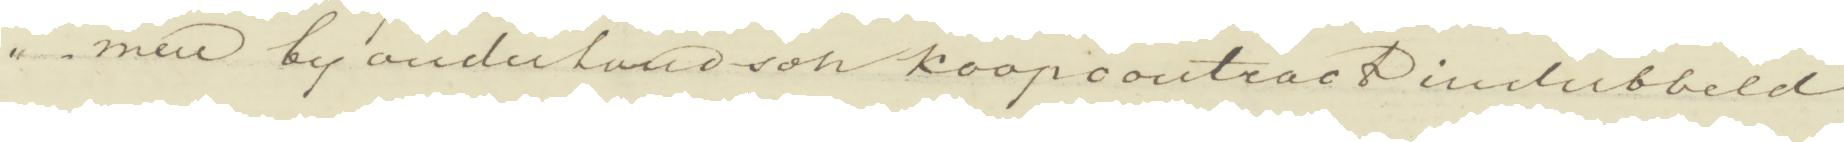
„ ,men bij onderhandsch koopcontract in dubbeld
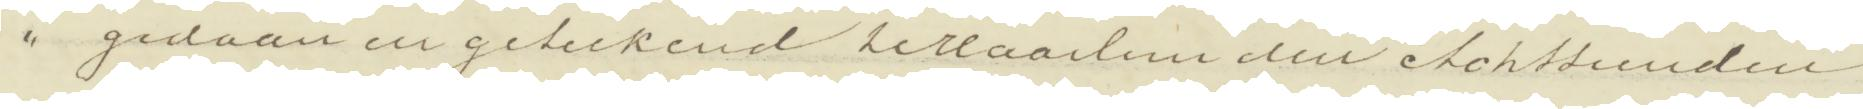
„ gedaan en geteekend te Haarlem den Achttienden
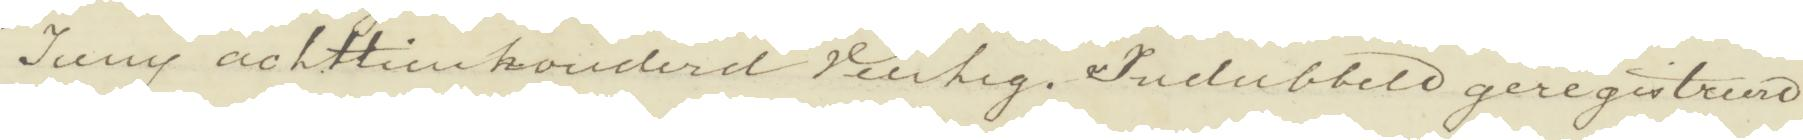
„ Iunij achttienhonderd Veertig. Indubbeld geregistreerd
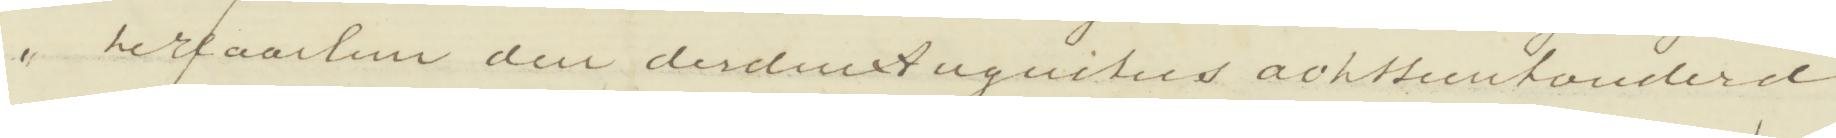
„ te Haarlem den derden Augustus achttienhonderd
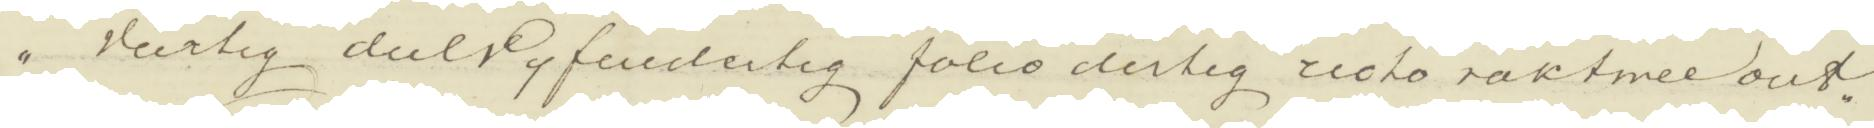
„ veertig deel Vyfendertig folio dertig recto vak twee ont„
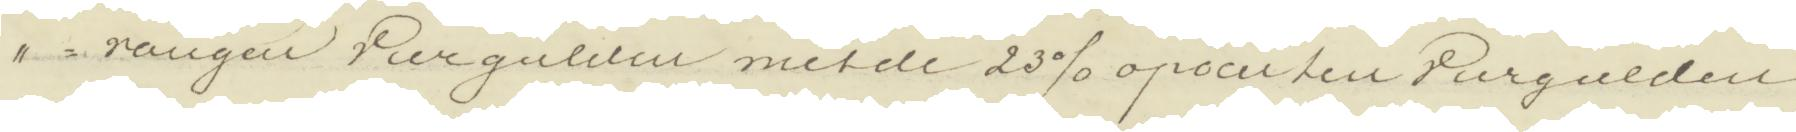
„ „vangen vier gulden met de 23% opcenten Vier gulden
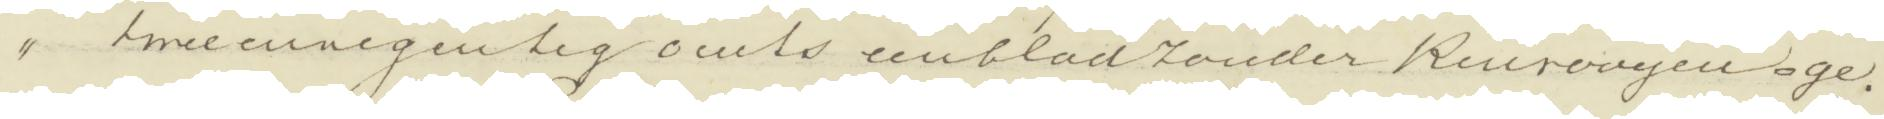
„ twee ennegentig cents een blad zonder Renvooyen =ge
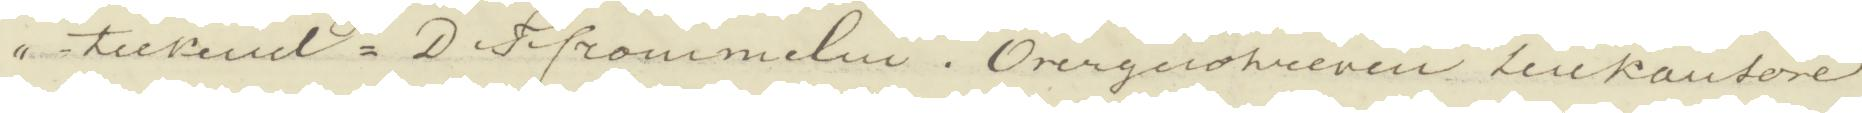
teekend = DF Crommelin. Overgeschreven ten kantore
